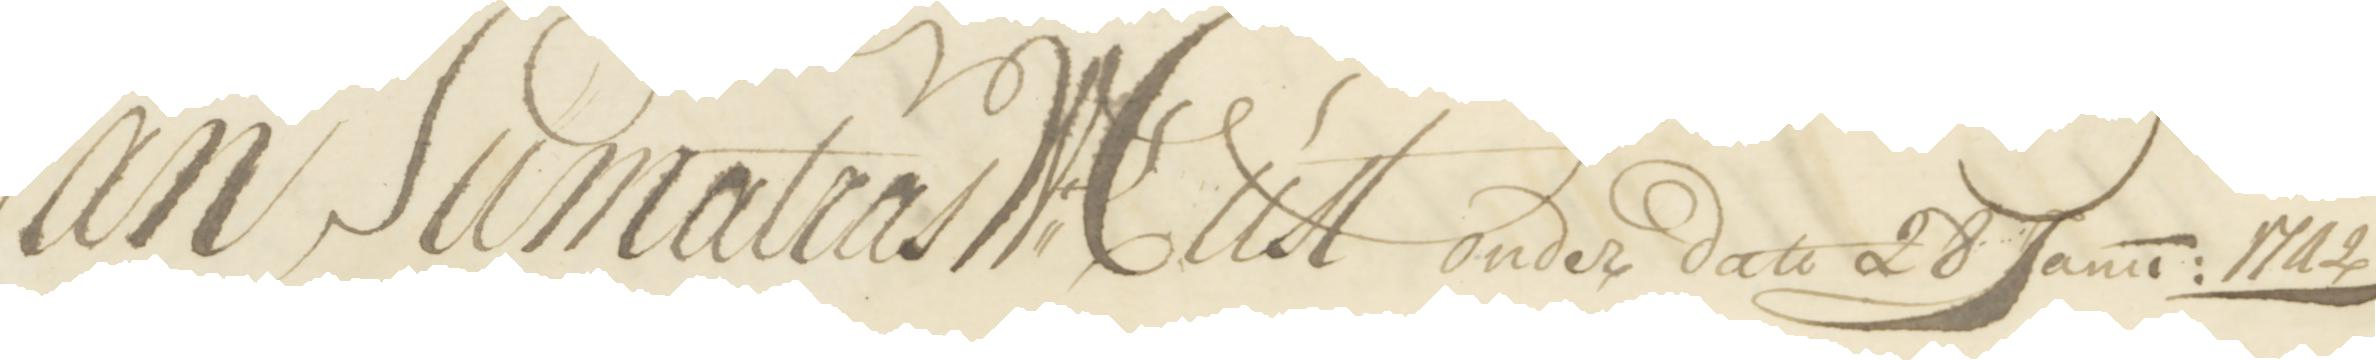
Van Sumatras W„t Cust onder dato 28 Janu: 1742
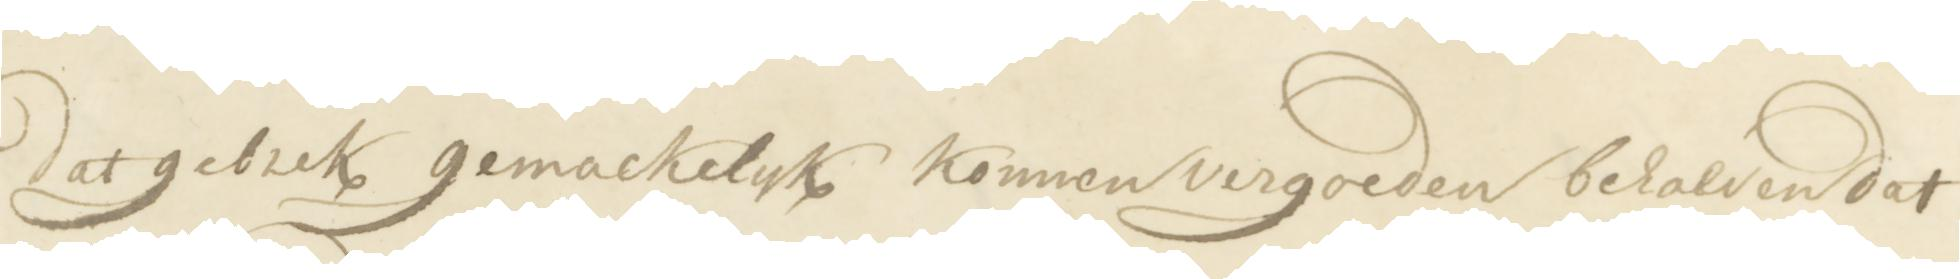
dat gebrek gemackelyk konnen vergoeden behalven dat
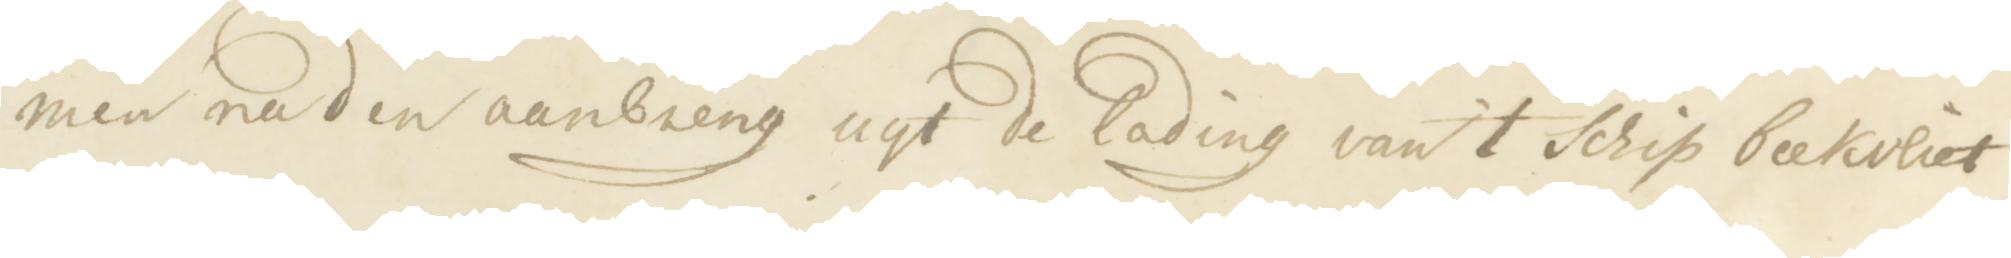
men na den aanbreng uyt de lading van ’t schip beekvliet
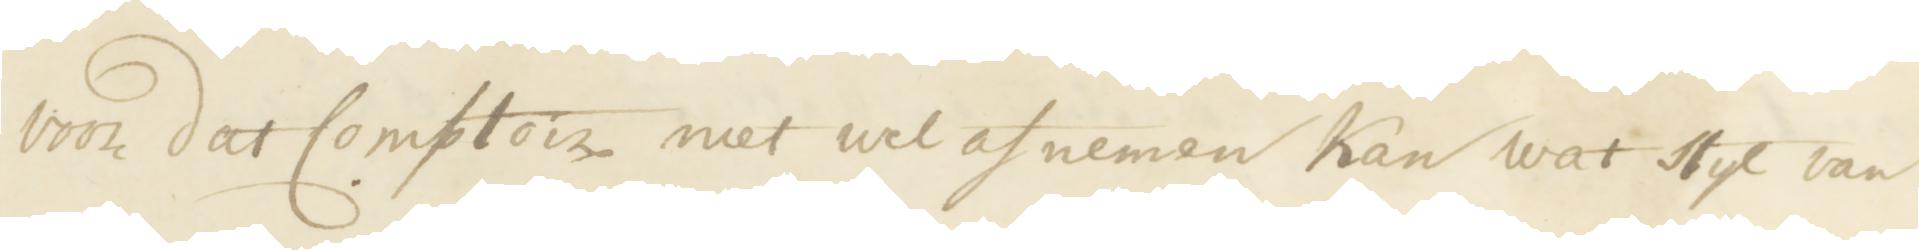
voor dat comptoir niet wel afnemen kan wat styl van
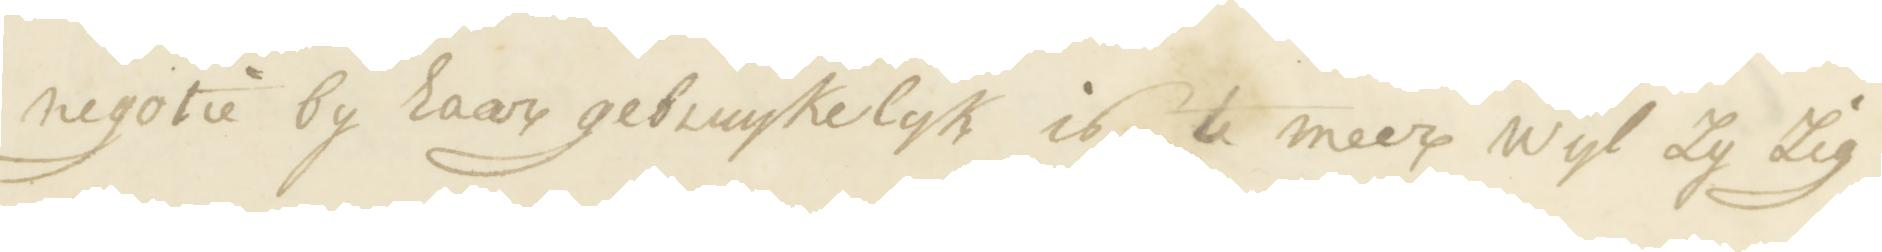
negotie bij haar gebruykelyk is te meer wijl zy zig
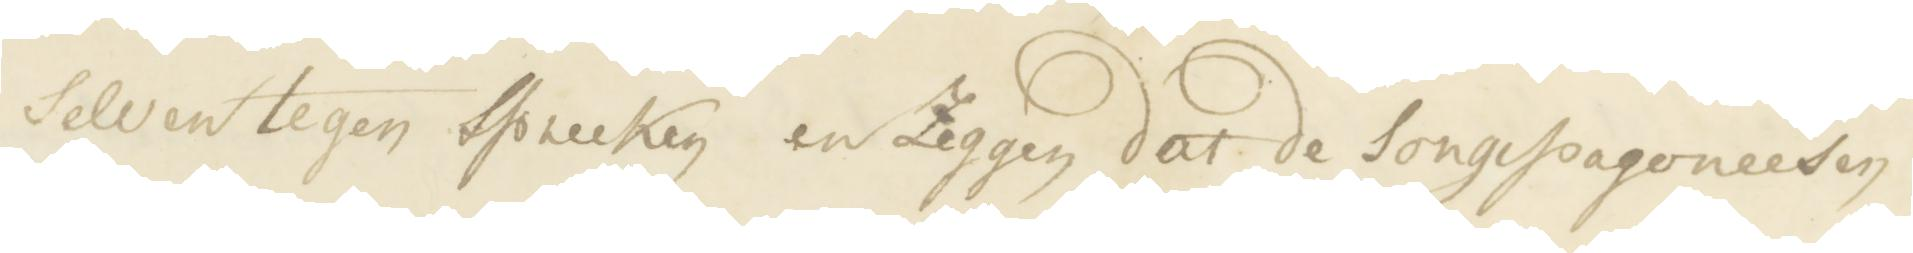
selven tegen spreeken en zeggen dat de songepageneesen
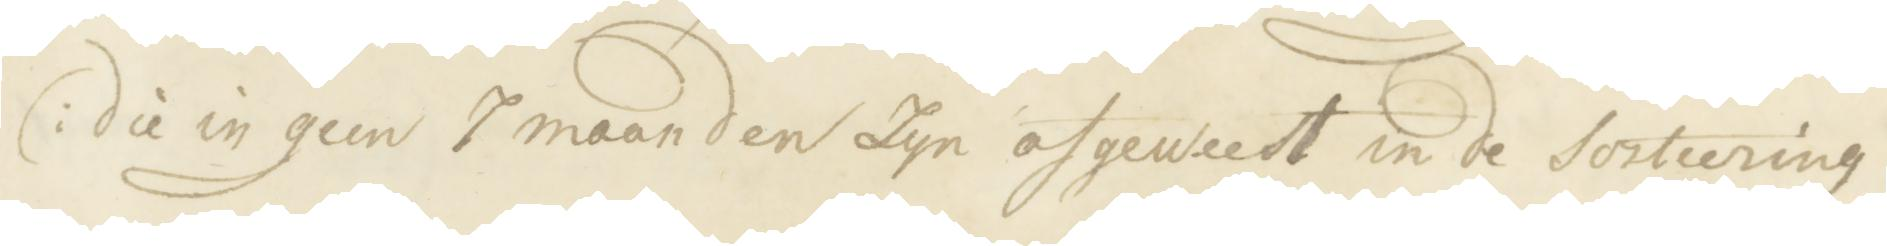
(:die in geen 7 maanden zyn afgeweest in de sorteering
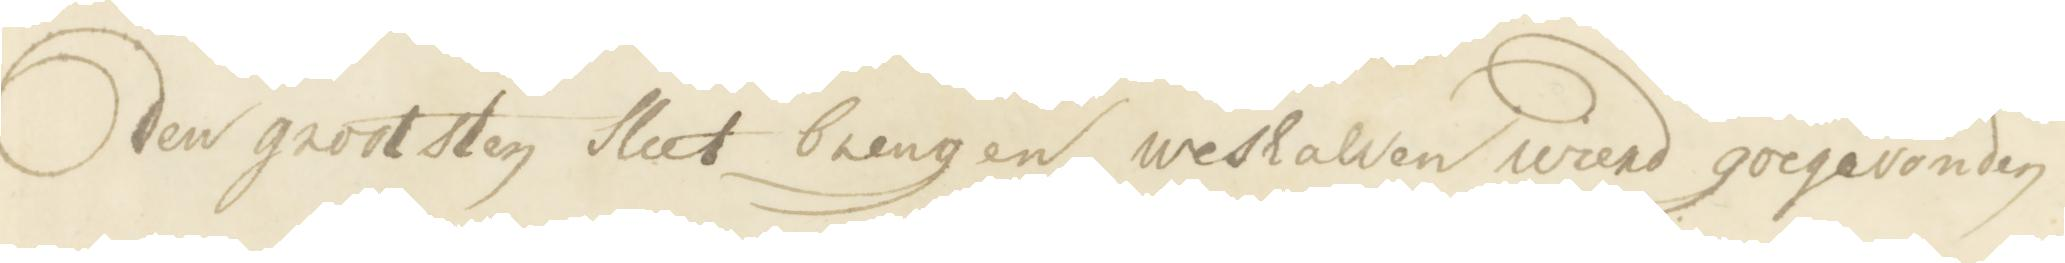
den grootsten sleet brengen, weshalven wierd goegevonden
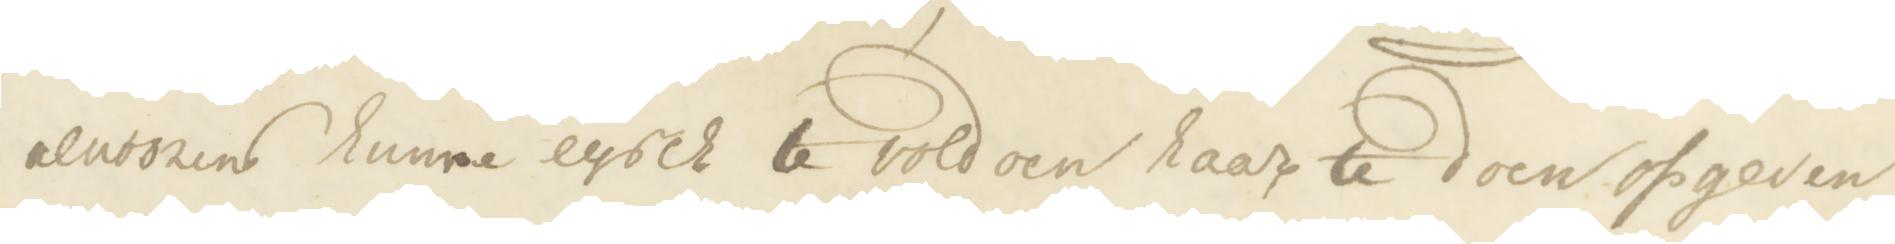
alvoorens hunne eysch te voldoen haar te doen opgeven
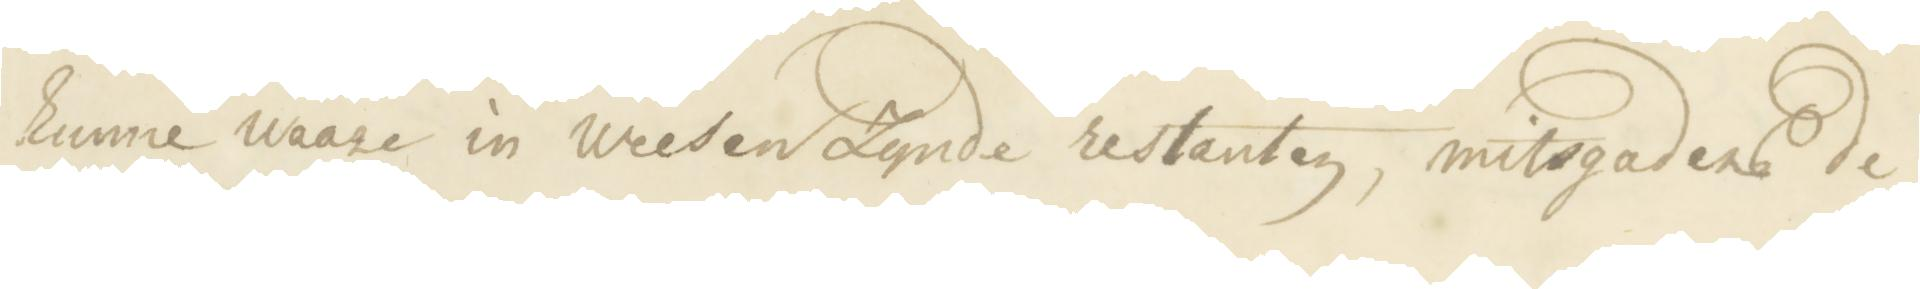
hunne waare in weesen zynde restanten, mitsgaders de
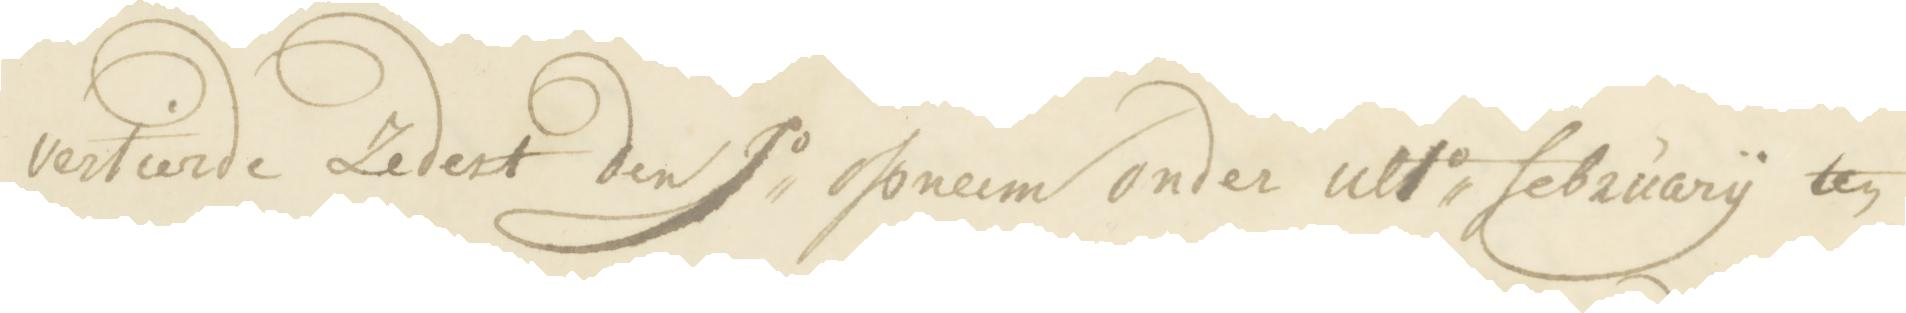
vertierde zedert den J„o opneem onder ult„o Februarij ten
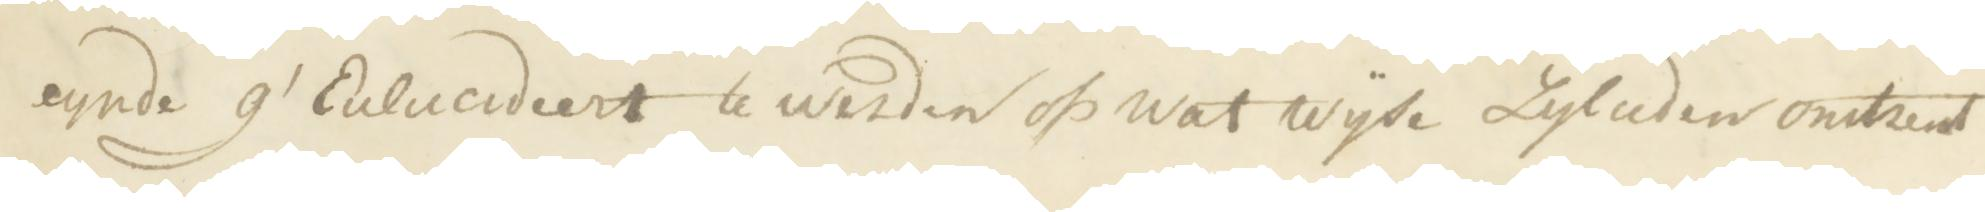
eynde g’Eulucideert te werden op wat wijse zylieden omtrent
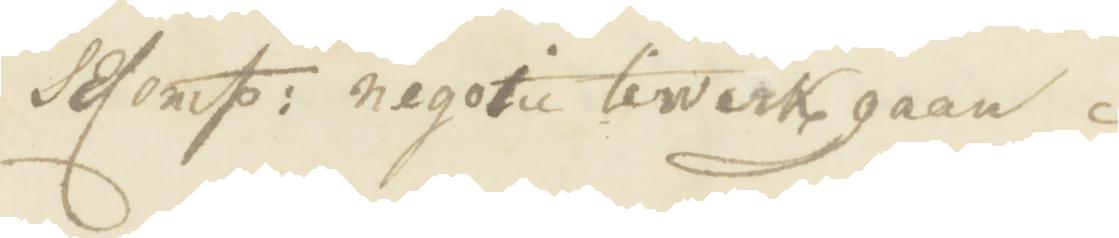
sEComp: negotie tewerk gaan—
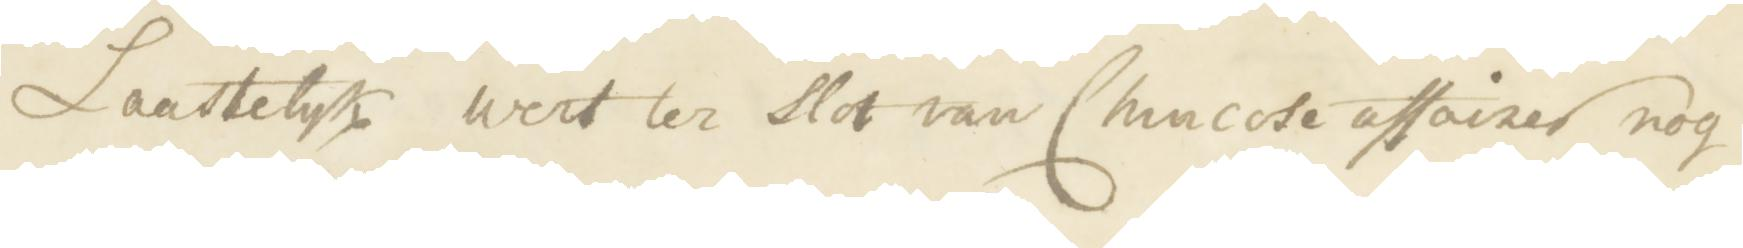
Laastelyk wert ter slot van Chincose affaires nog
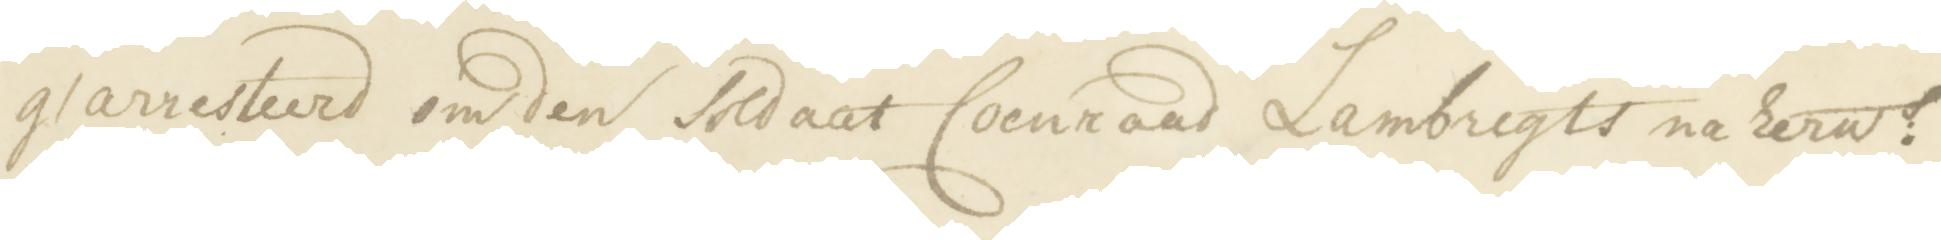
g’arresteerd om den soldaat Coenraad Lambregts na herw:s
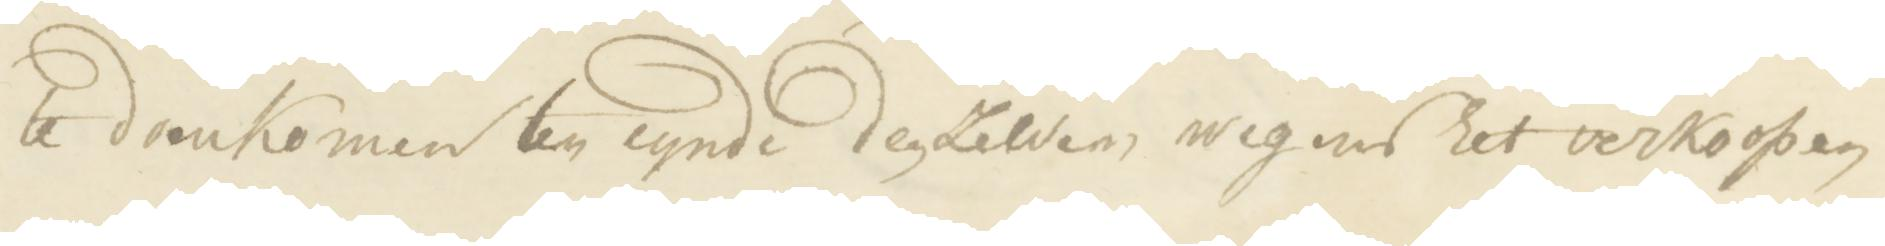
te doen komen ten eijnde denzelven wegens het verkoopen
